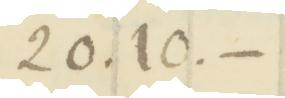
20.10.—
